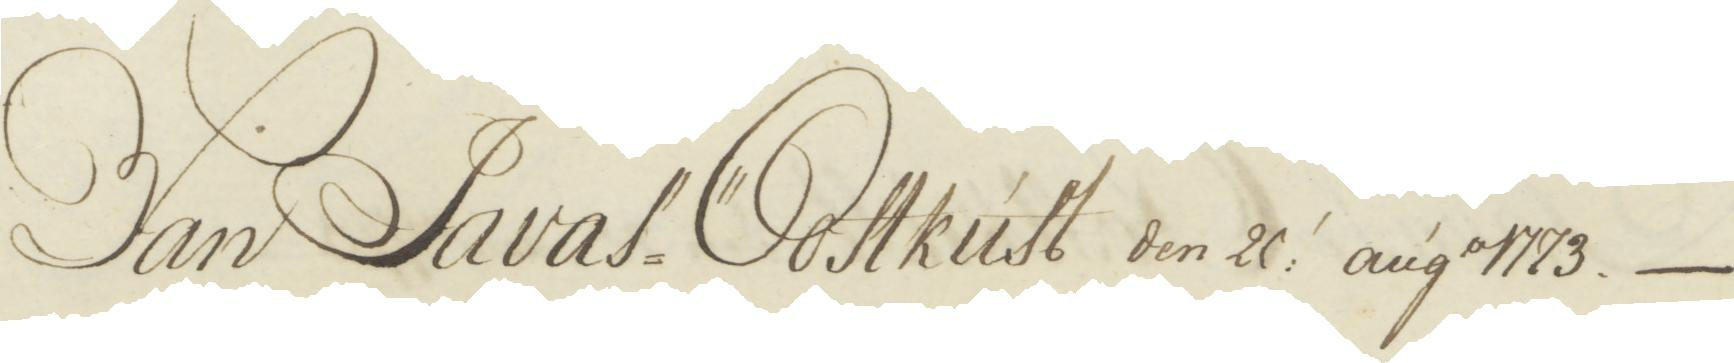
Van Iavas= Oostkust den 20:' aug 1773. —
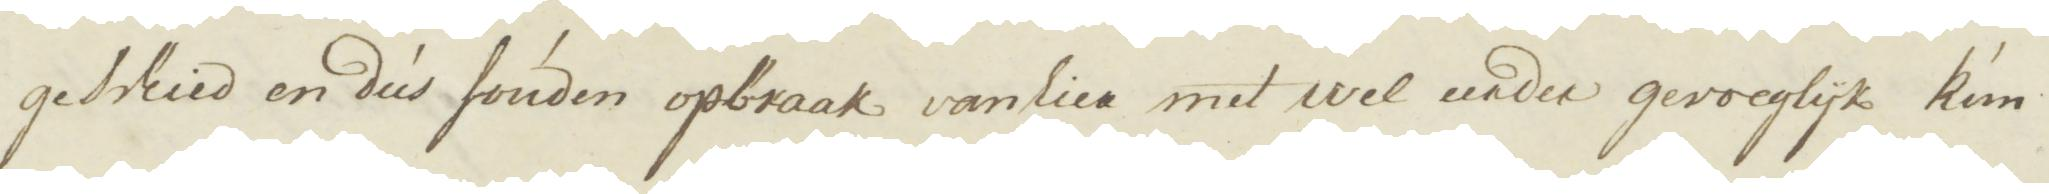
geschied en dus souden opbraak van hier met wel eerder gevoeglijk kun
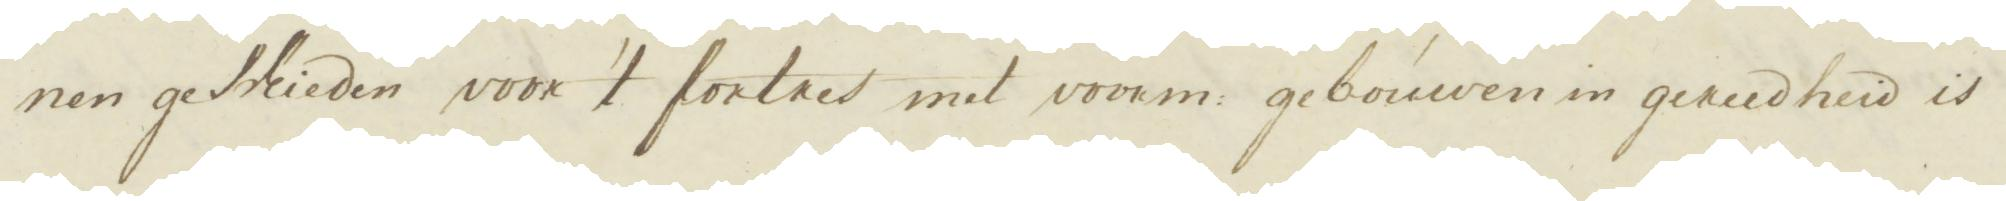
nen geschieden voor ’t fortres met voorm: gebouwen in gereedheid is
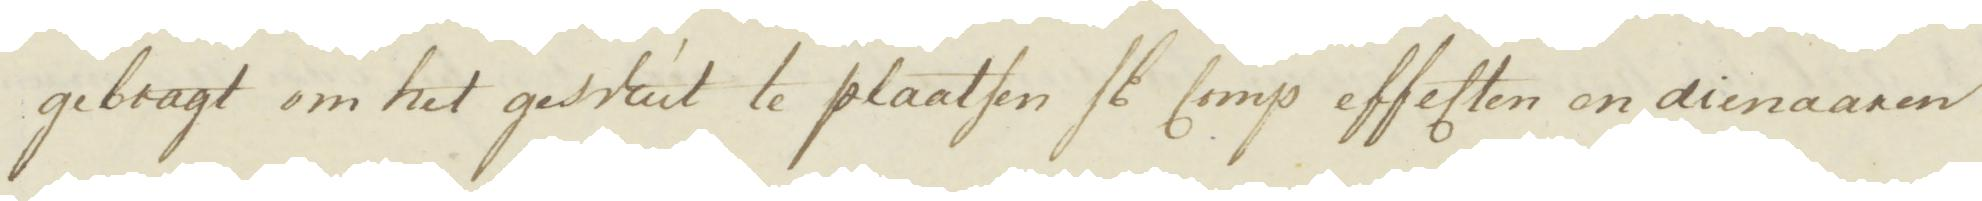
gebragt om het geschut te plaatsen sE Comp effecten en dienaaren
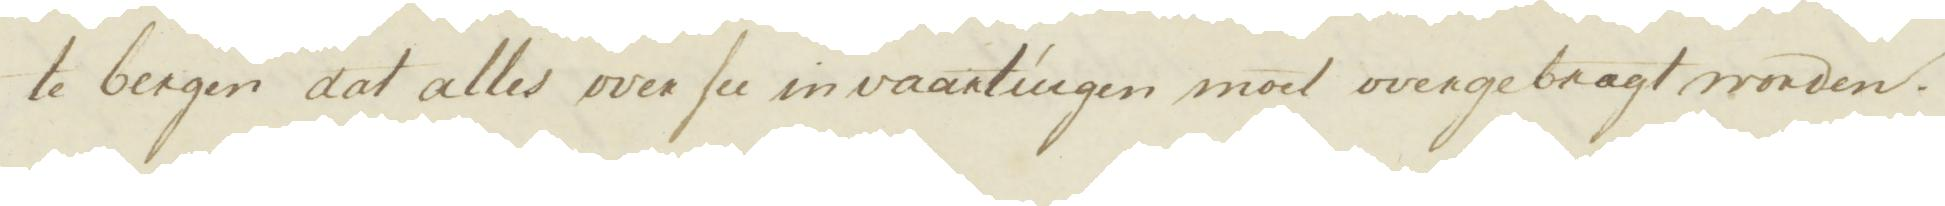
te bergen dat alles over see in vaartuigen moet overgebragt worden.
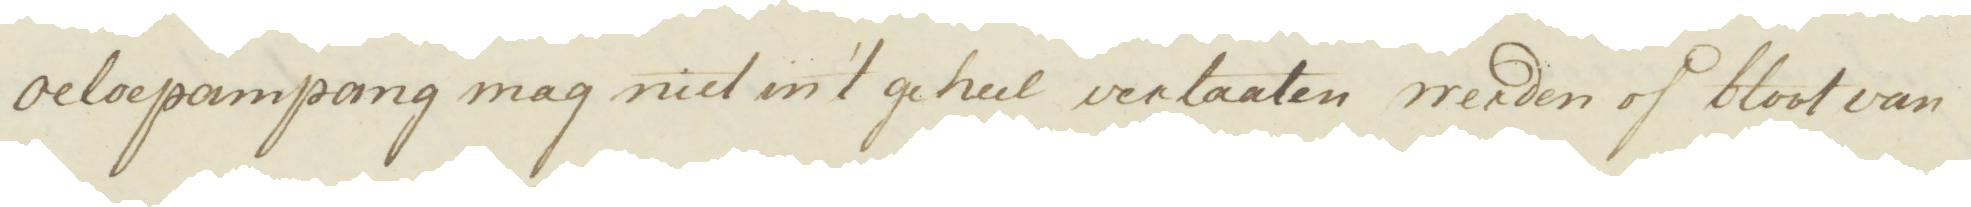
oeloepampang mag niet in ’t geheel verlaaten werden of bloot van
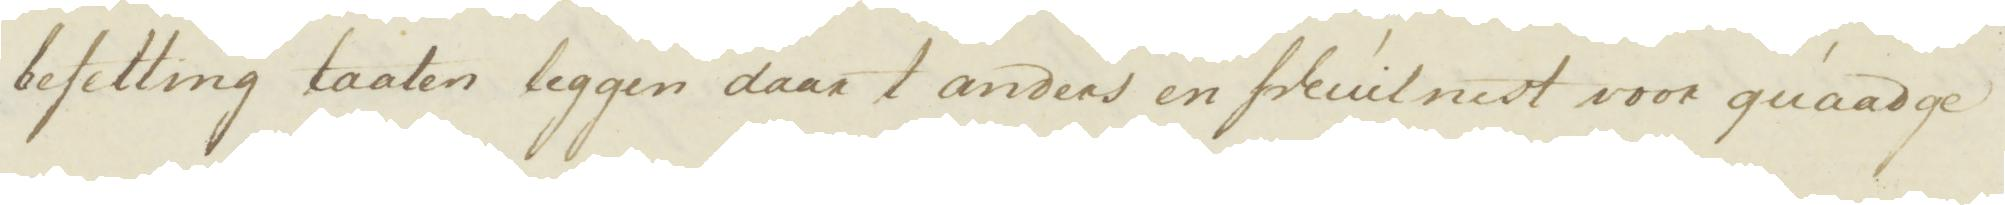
besetting laaten leggen daar ’t anders en schuilnest voor quaadge
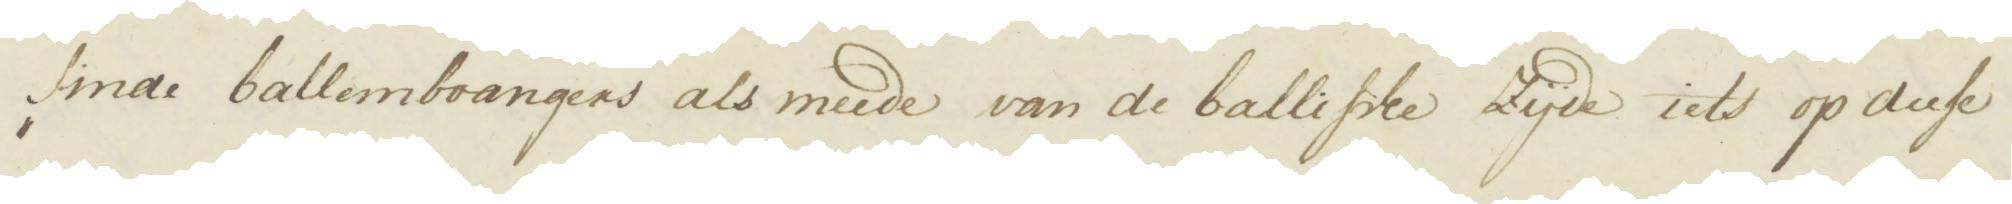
sinde ballemboangers als meede van de ballische zijde iets op deese
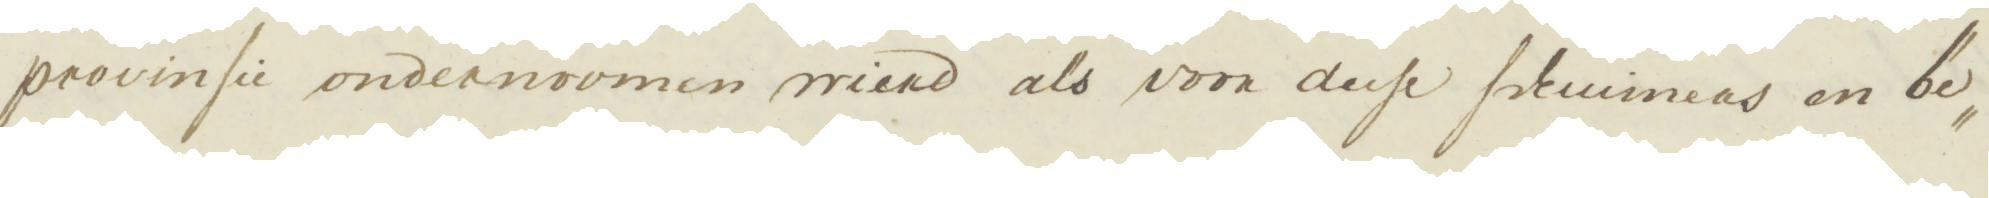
provinsie ondernoomen wierd als voor deese schuimers en be„
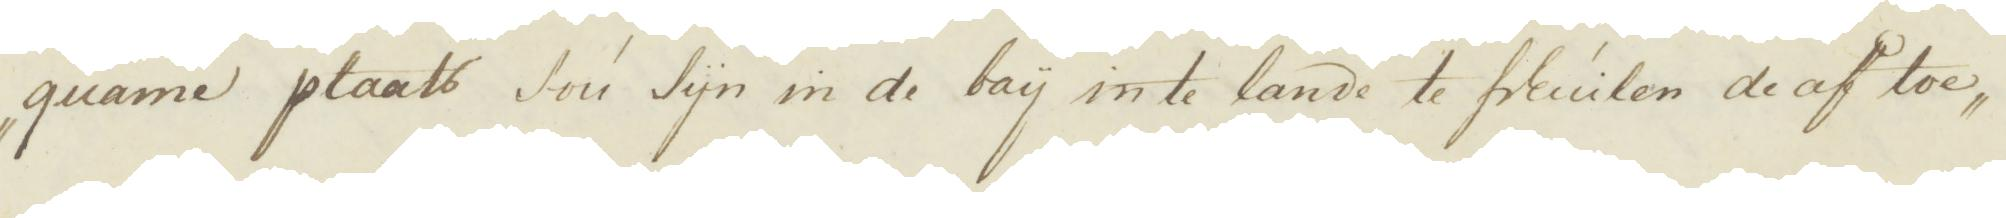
„quame plaats sou sijn in de baij in te lande te schuilen de af toe„
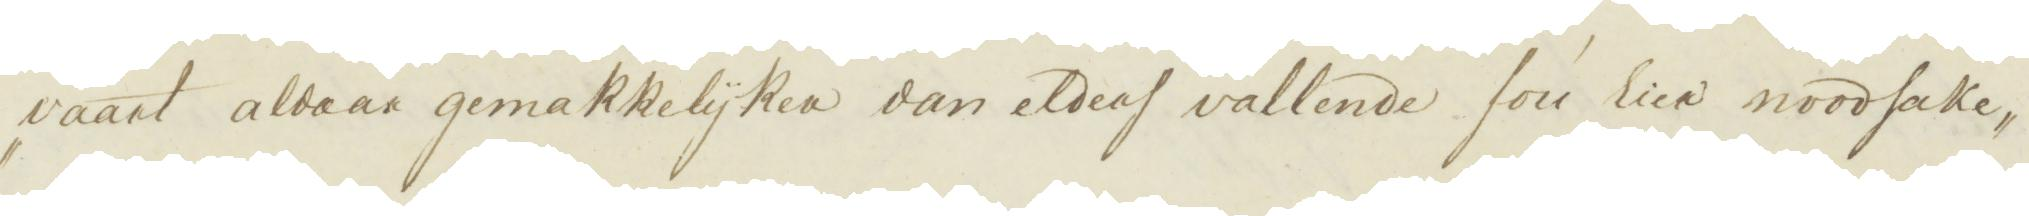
vaart aldaar gemakkelijker dan elders vallende sou hier noodsake„
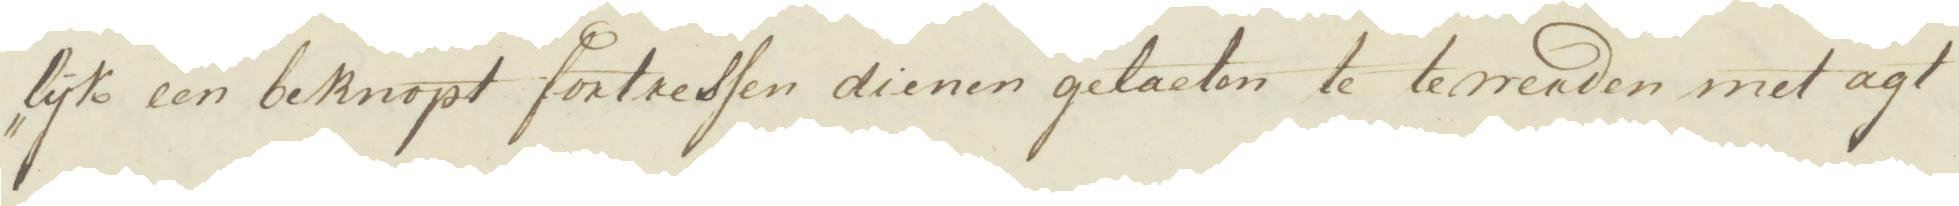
„lijk een beknopt fortressen dienen gelaeten te te werden met agt
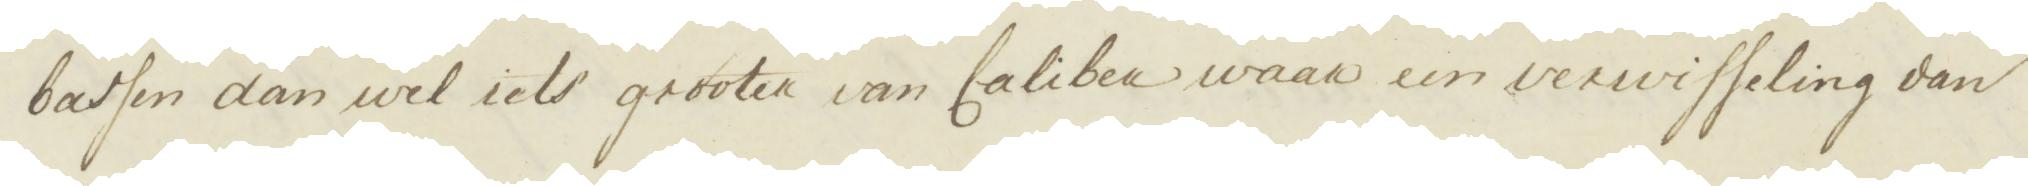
bassen dan wel iets grooter van Caliber waar een verwisseling dan
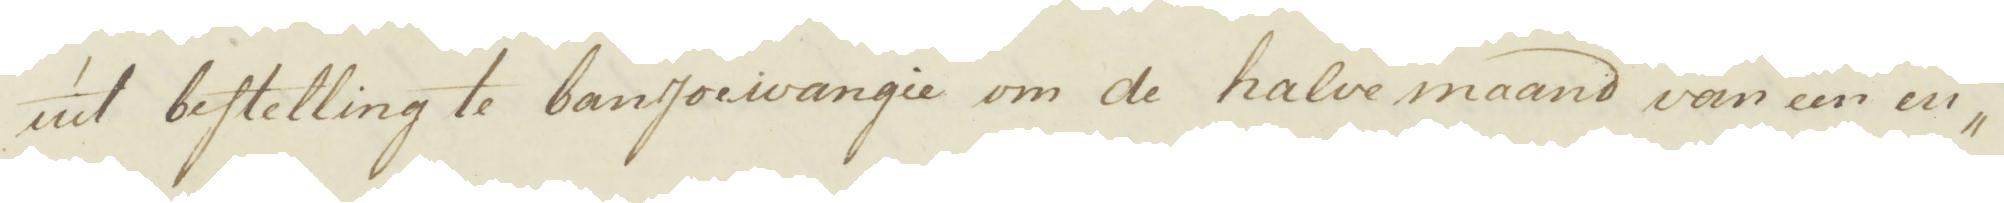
uit bestelling te banjoewangie om de halve maand van een eu„
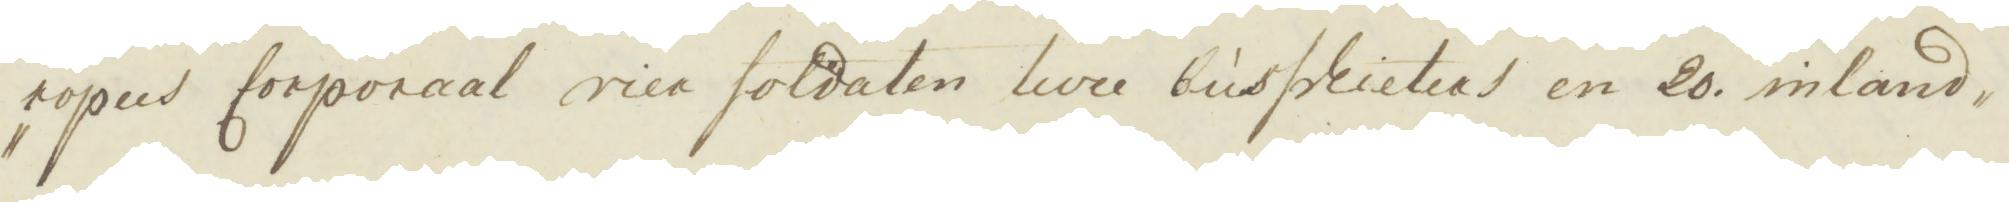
„ropees Corporaal vier soldaten twee busschieters en 20. inland„
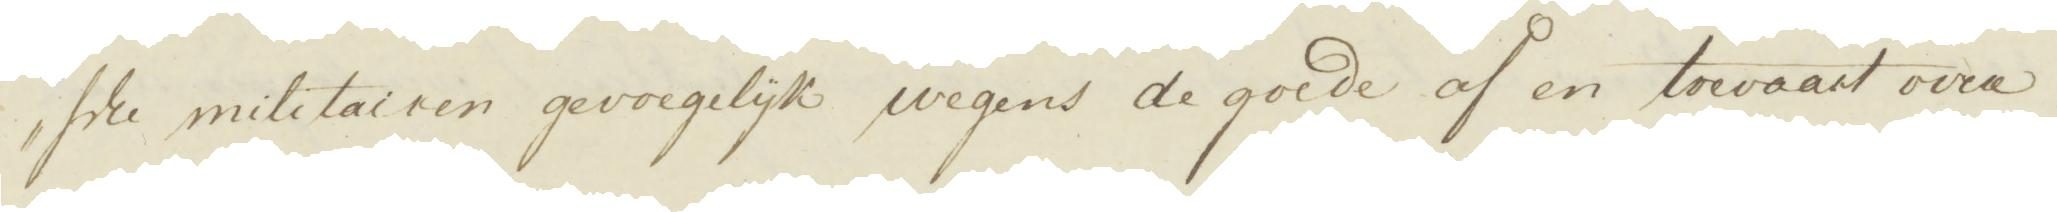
„sche militairen gevoegelijk wegens de goede af en toevaart over
